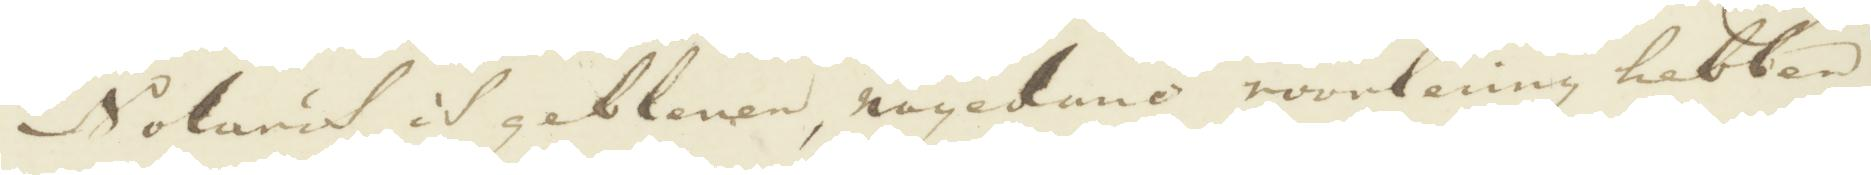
Notaris is gebleven, nagedane voorlezing hebben
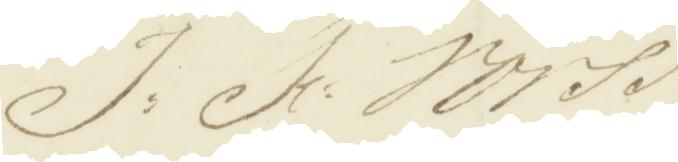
J: F. Vorss
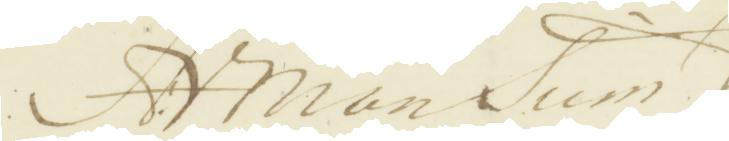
A:VMansum
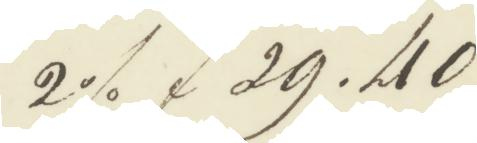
2% ƒ 29.40
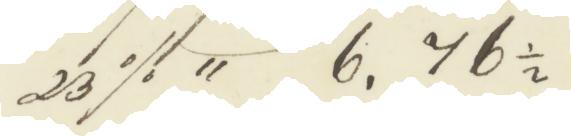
23% „ 6, 76½
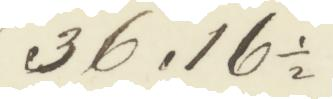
36.16½
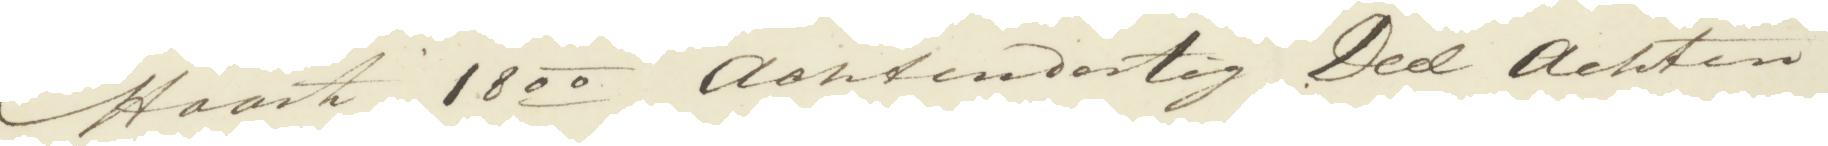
Maart 1800 Achtendertig Deel Achten
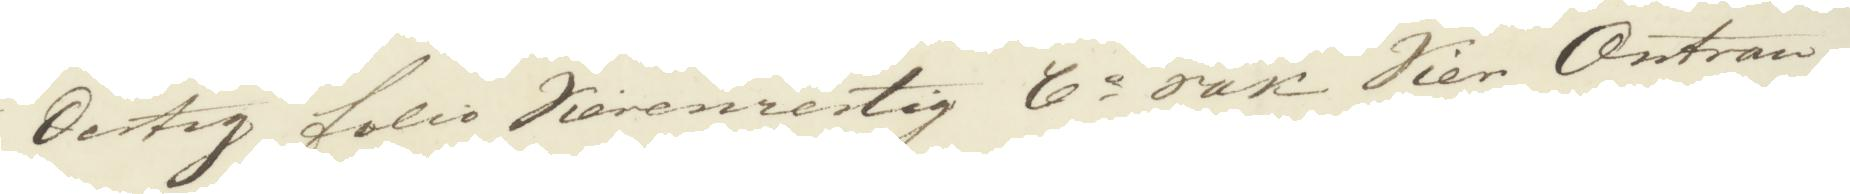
dertig folio Vierenzestig R-o vak Vier Ontvan
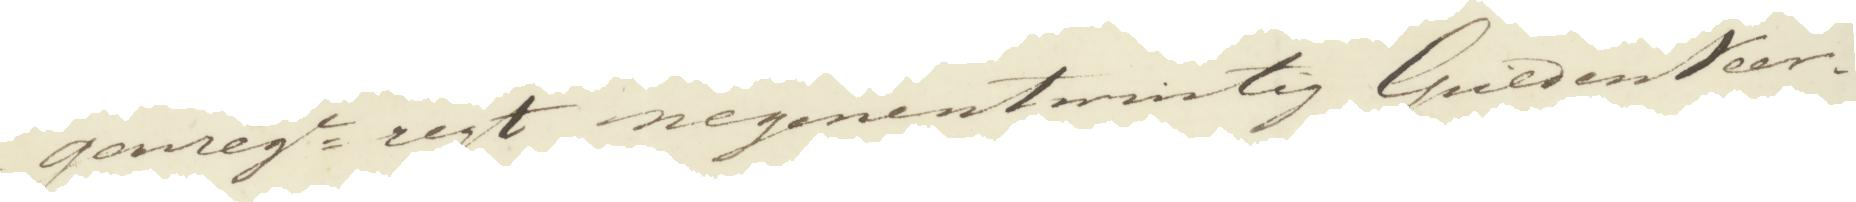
gen reg=e regt negenentwintig Gulden Veer„
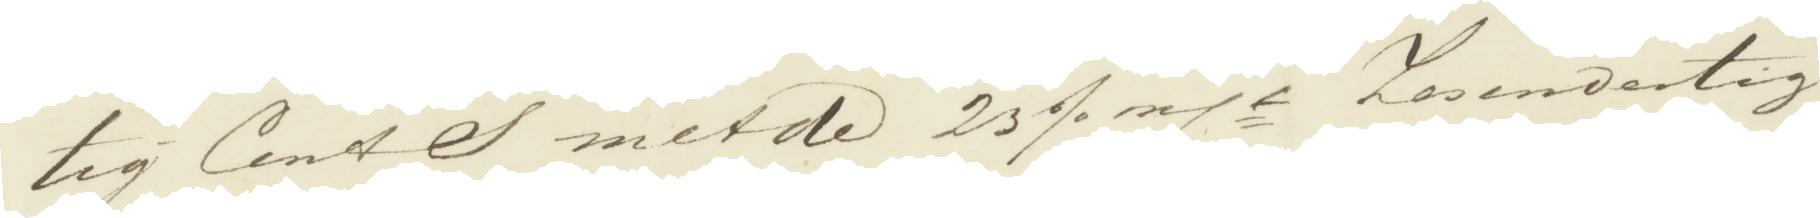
tig Cents met de 23%. onC=t Zes endertig
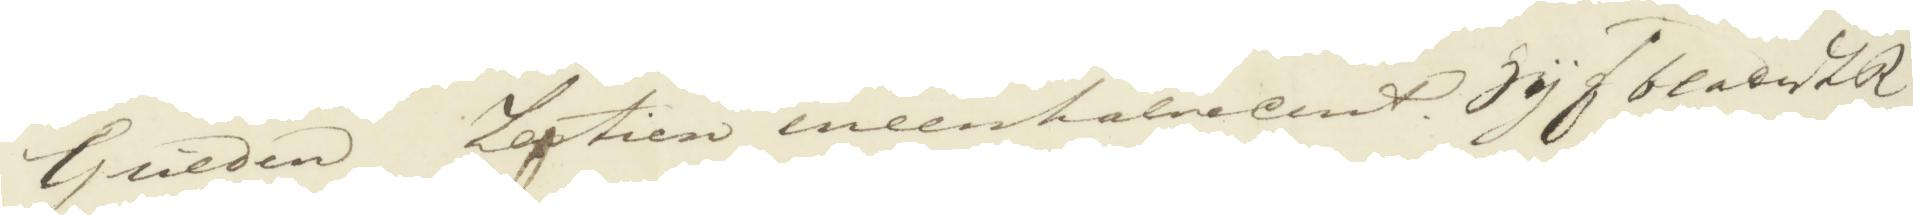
Gulden Zestien en een halve cent Vijf bladen ZR
